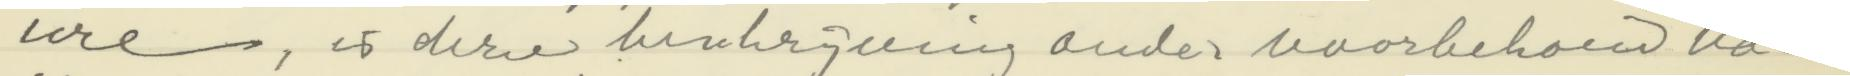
ure, is deze beschrijving onder voorbehoud van
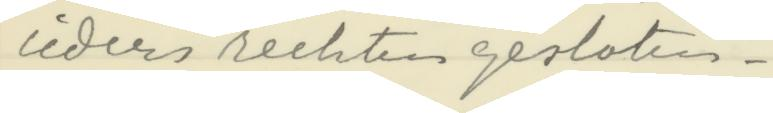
ieders rechten gesloten-
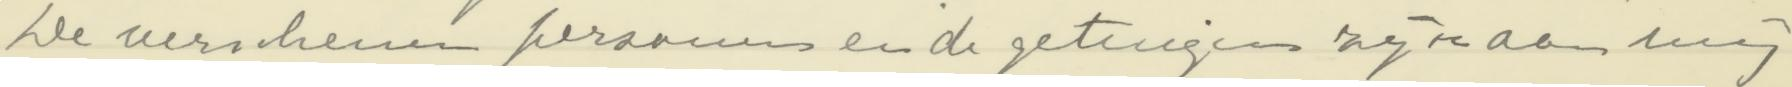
De verschenen personen en de getuigen zijn aan mij
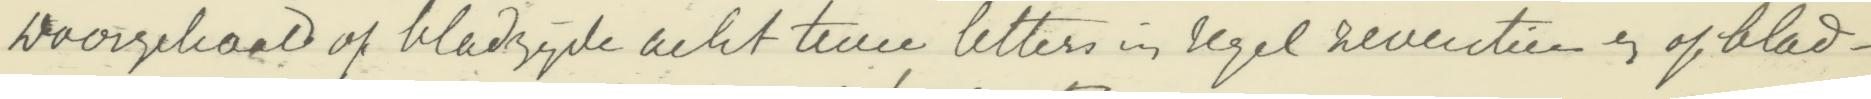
Doorgehaad op bladzijde acht twee letters in regel zeventien en op blad-
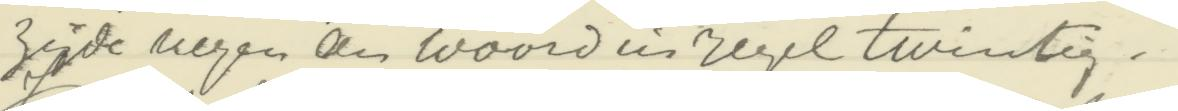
zijde negen een woord in regel twintig.
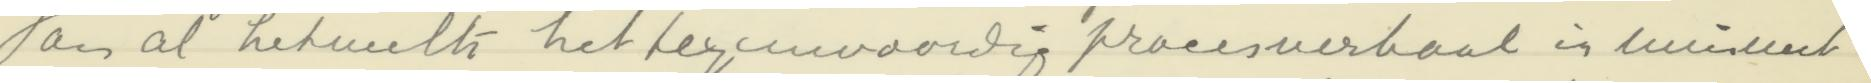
Van al hetwelk het tegenwoordig procesverbaal in minuut
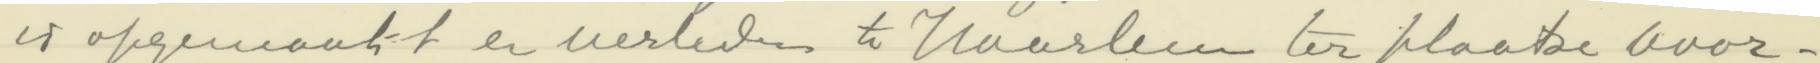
is opgemaakt en verleden te Haarlem ter plaatse voor-
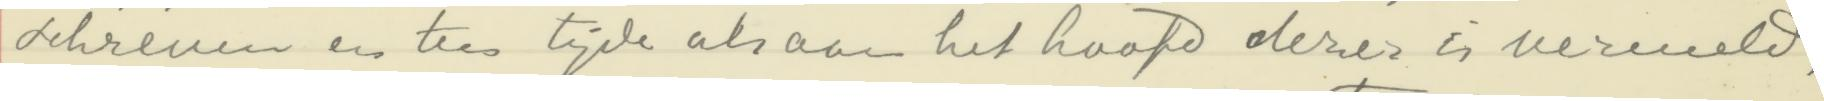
schreven en ten tijde als aan het hoofd dezes in vermeld,
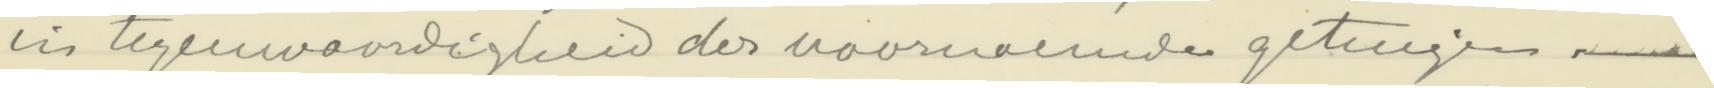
in tegenwoordigheid der voornoemde getuigen —
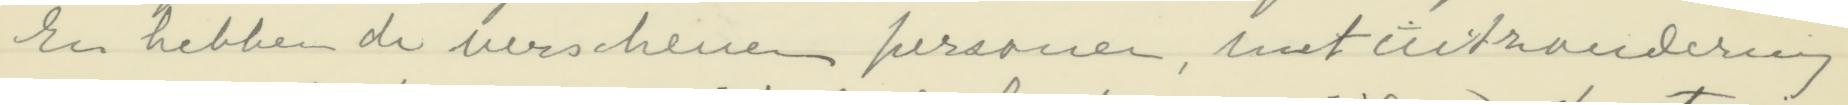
Een hebben de verschenen personen, met uitzondering
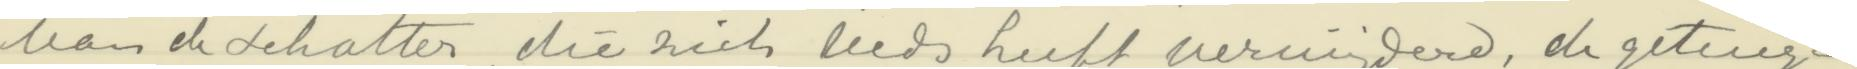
van de schatter, die zich reeds heeft verwijderd, de getuigen
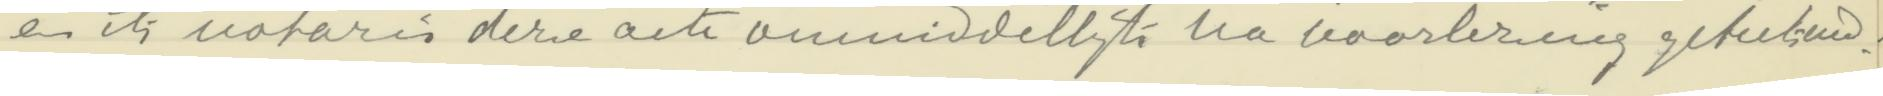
en ik notaris deze acte omiddellijk na voorlezing geteekend,
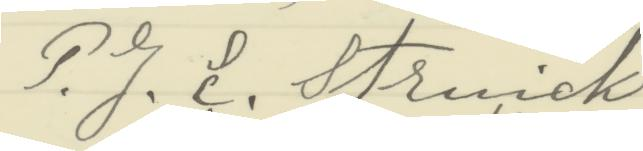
P. J. E. Struick
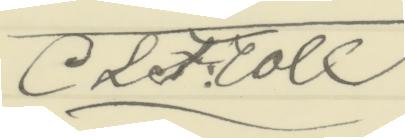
CLF:roll
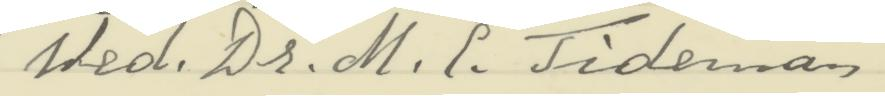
Wed. Dr. M. C. Tideman
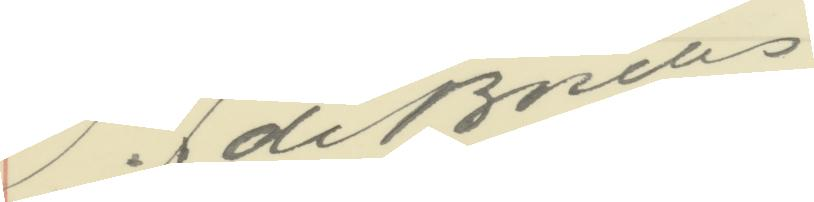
P:f de Bordes
